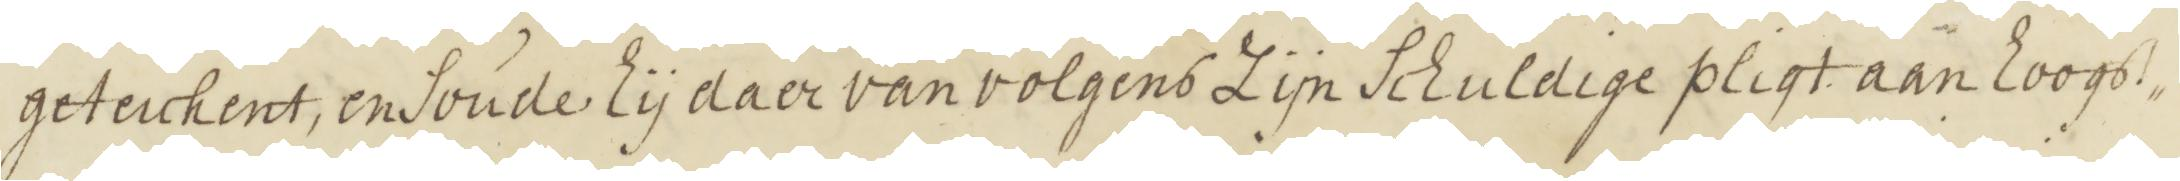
geteickent, en soude hij daer van volgens zijn schuldige pligt aan hoogt„
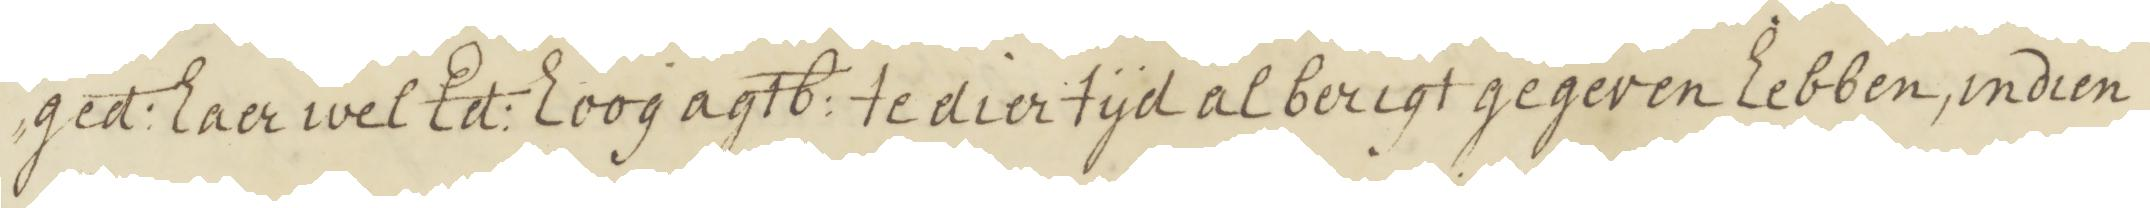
„ged: haer wel Ed: hoog agtb: te dier tijd al berigt gegeven hebben, indien
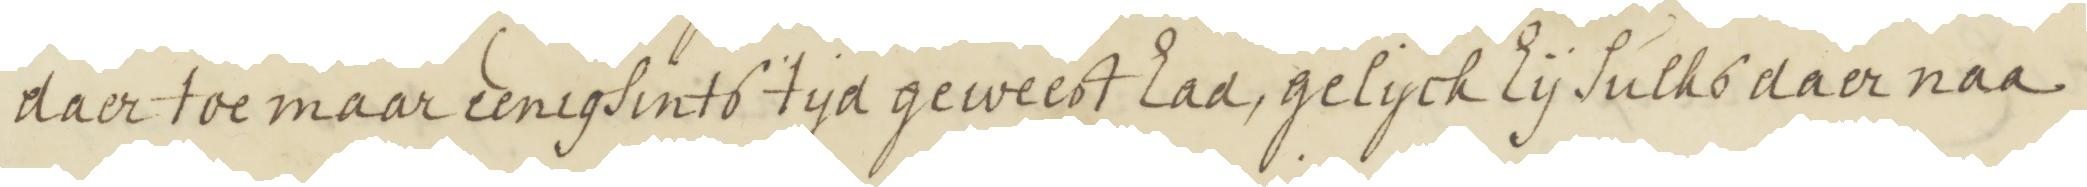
daer toe maar eenigsints tijd geweest had, gelijck hij sulks daer naa
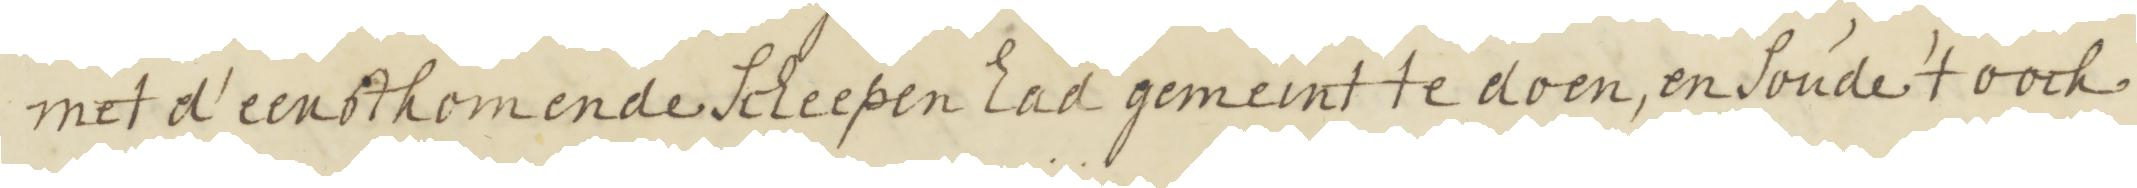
met d’eerstkomende scheepen had gemeint te doen, en soude ’t oock
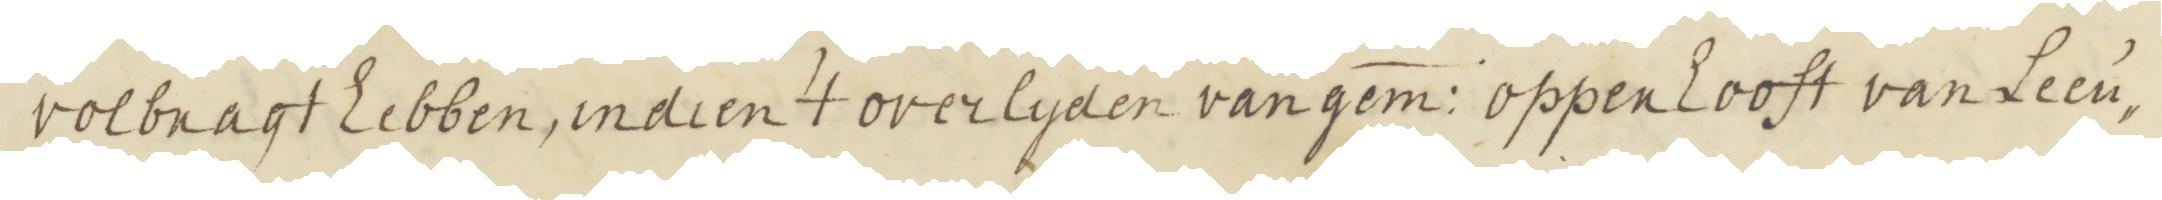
volbragt hebben, indien ’t overlijden van gem: opperhooft van Leeu„
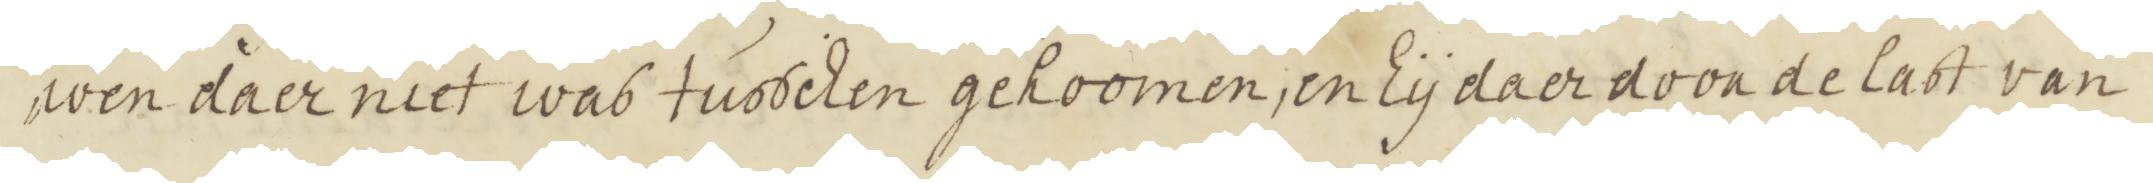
„wen daer niet was tusschen gekoomen, en hij daer door de last van
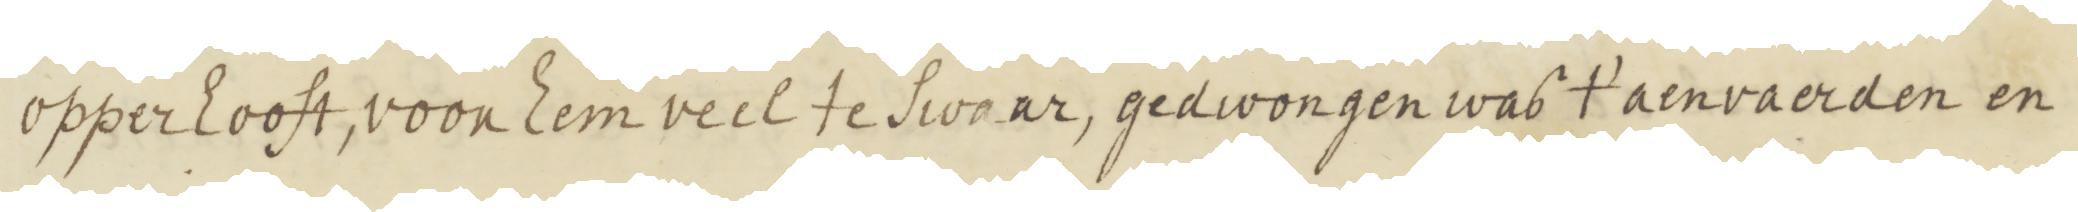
opperhooft, voor hem veel te swaar, gedwongen was t' aenvaerden en
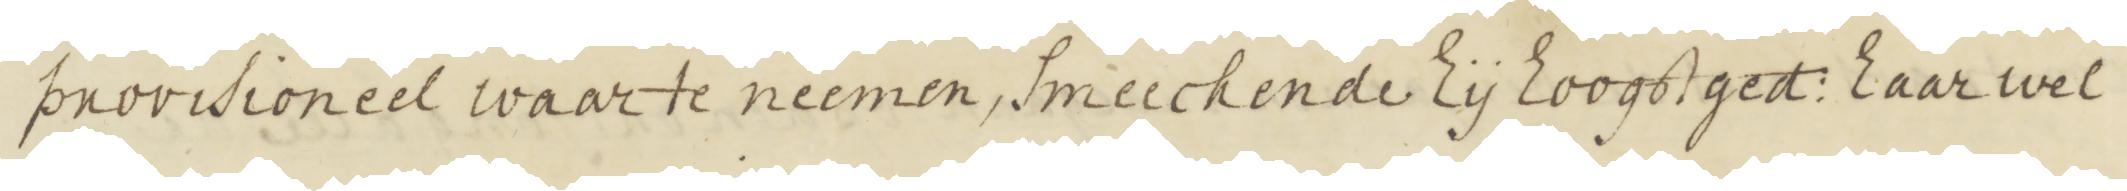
provisioneel waar te neemen, smeeckende hij hoogstged: haar wel
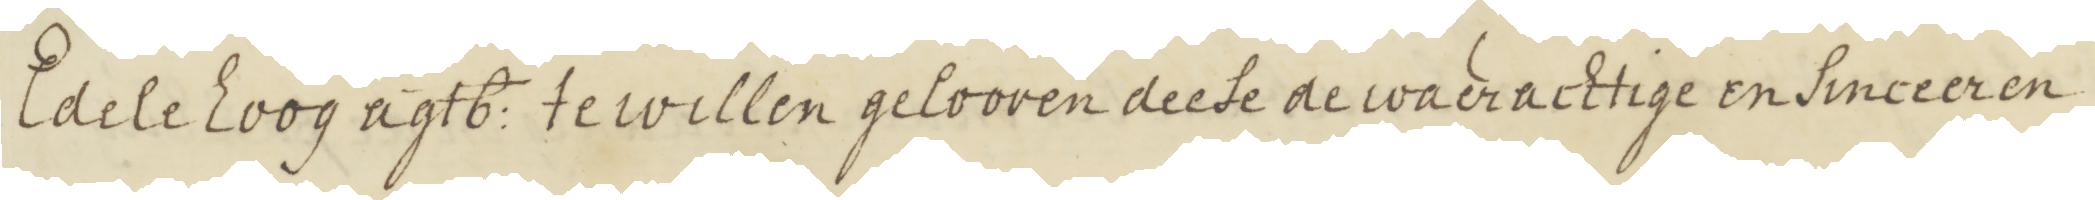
Edele hoog agtb: te willen gelooven deese de waerachtige en sinceeren
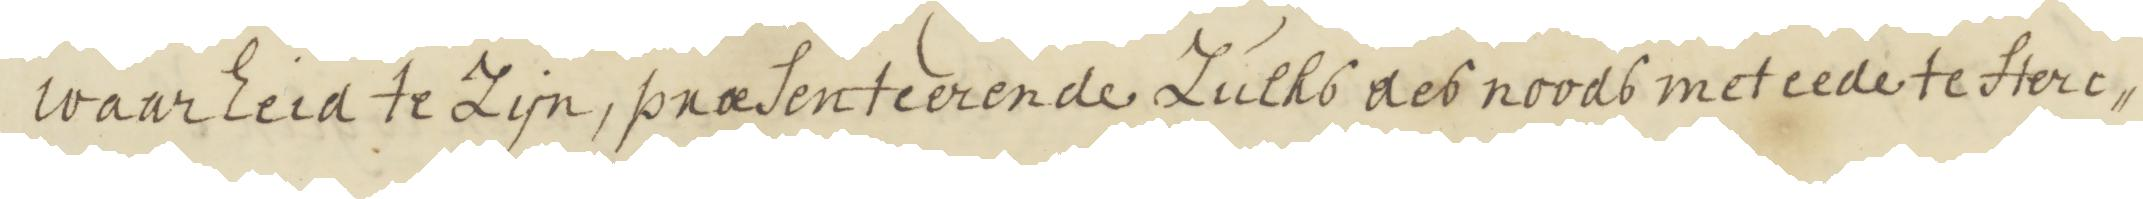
waarheid te zijn, praesenteerende zulks des noods met eede te sterc„
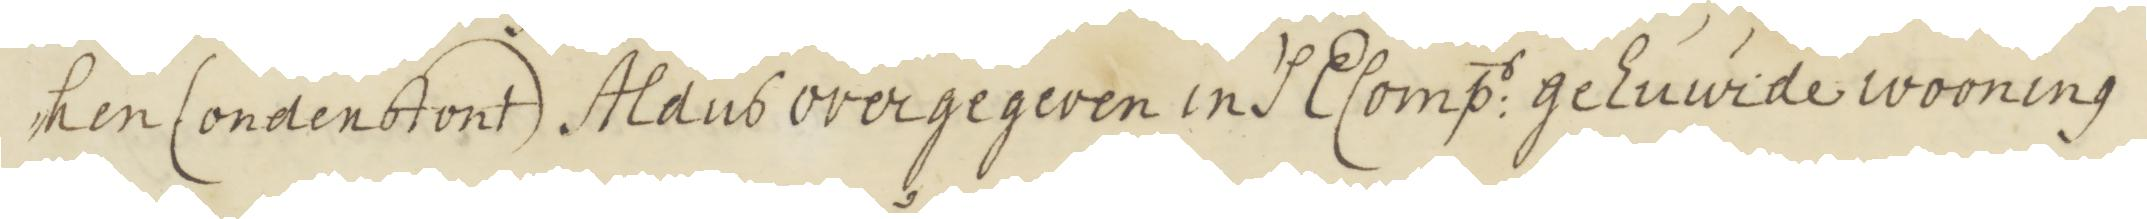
„ken (onderstont) Aldus overgegeven in ’s EComp:s gehuurde wooning
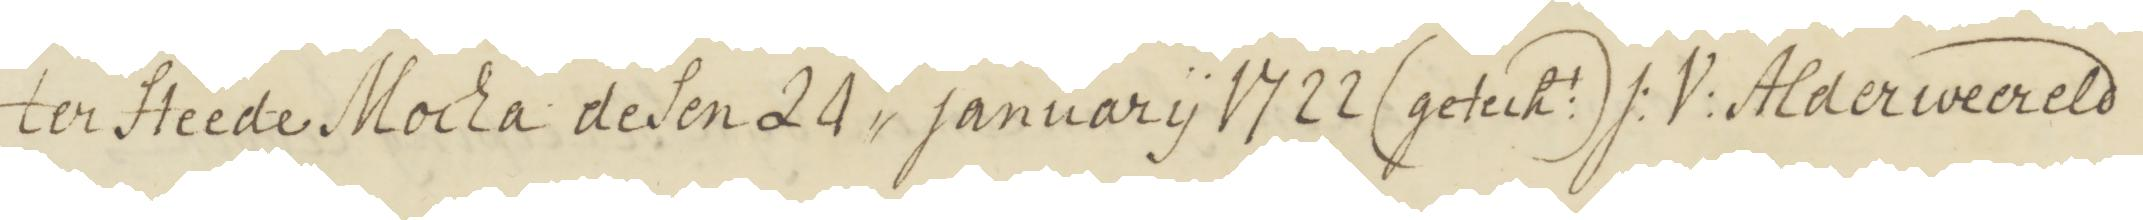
ter steede Mocha desen 24„' januarij 1722 (geteik:t) J: V: Alderweereld
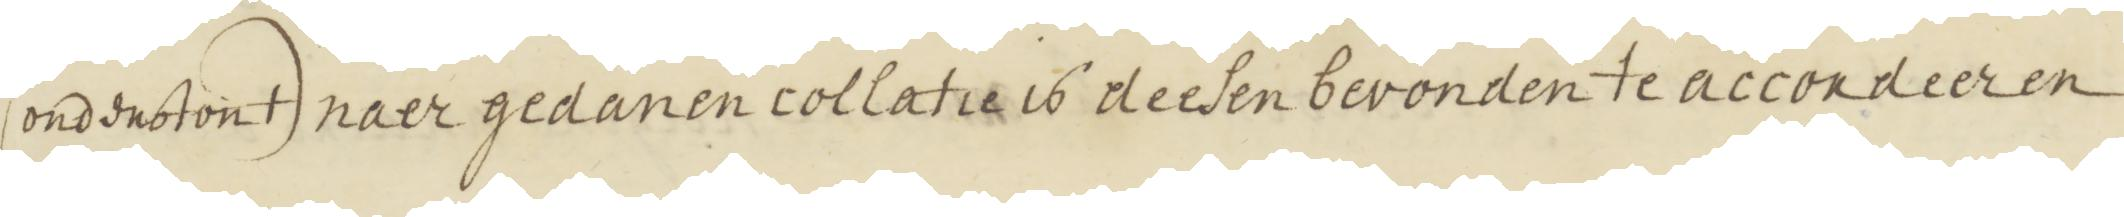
(onderstont) naer gedanen collatie is deesen bevonden te accordeeren
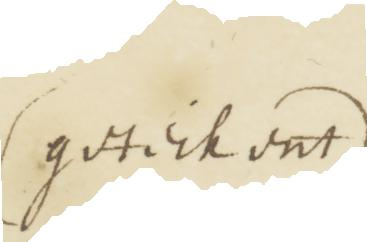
(geteikent)
